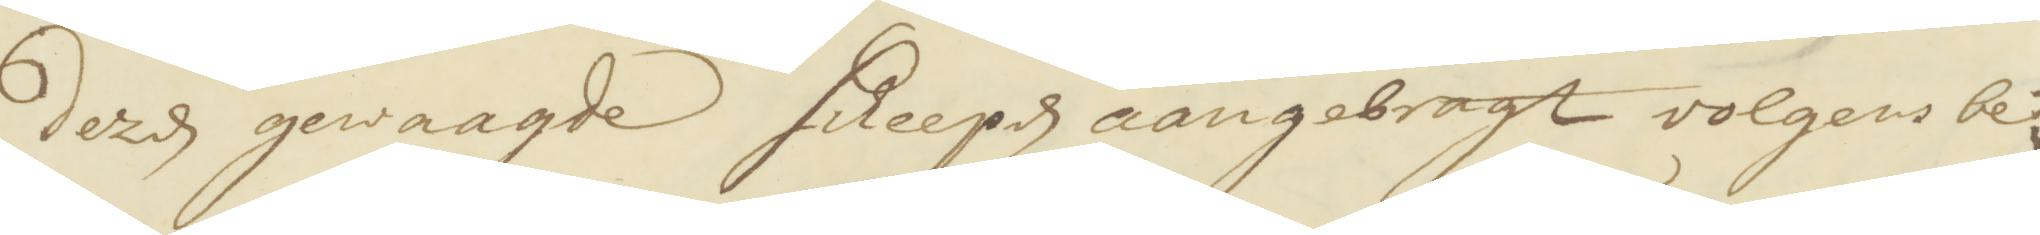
dezen gewaagde scheepen aangebragt volgens be
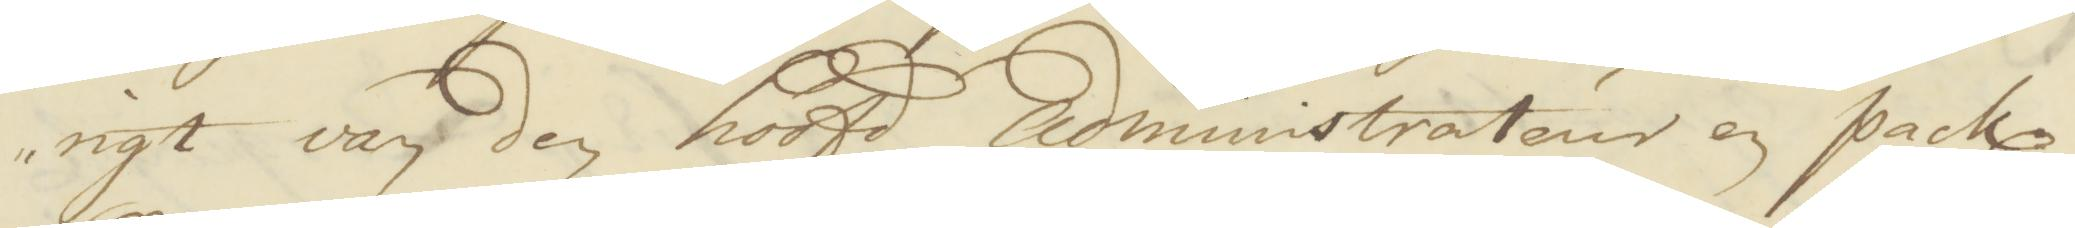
„rigt van den hoofd Administrateur en pack
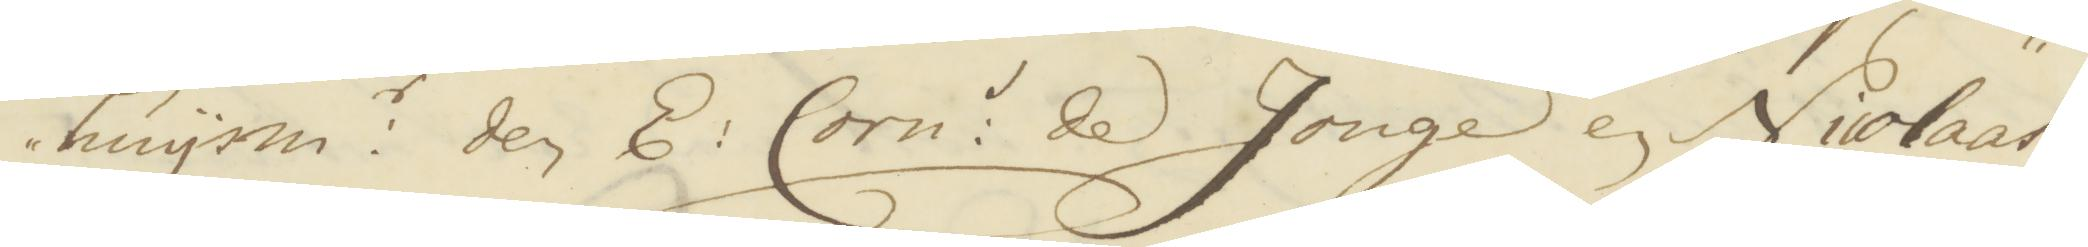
„huijsm:r den E: Corn:s de Jonge en Nicolaas
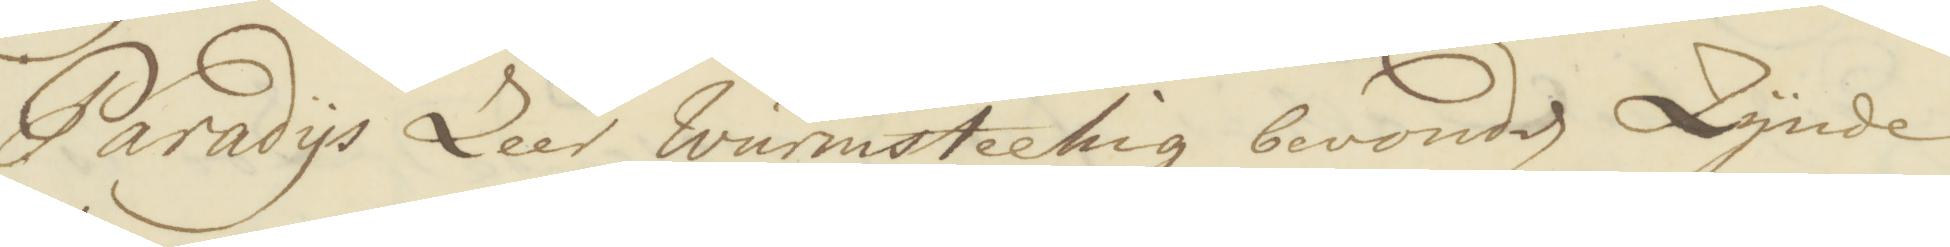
Paradijs zeer wurmsteekig bevonden zijnde,
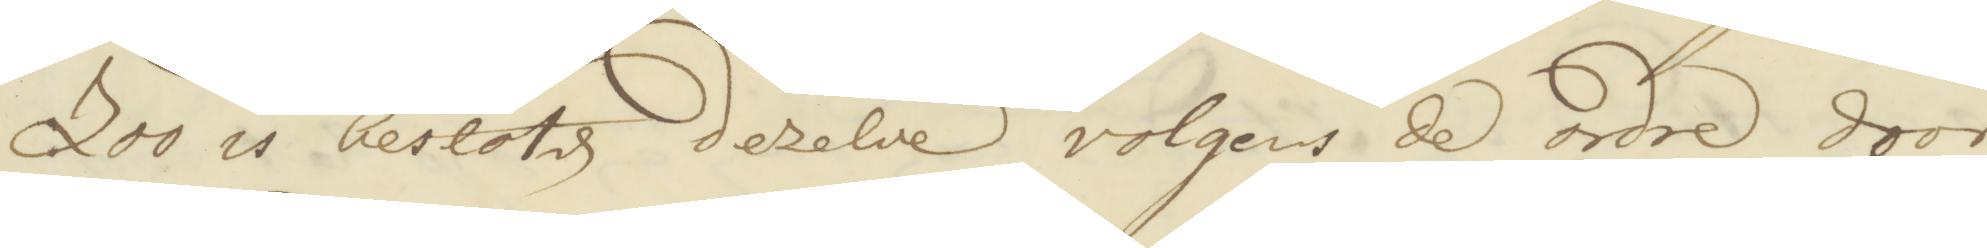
zoo is besloten dezelve volgens de ordre door
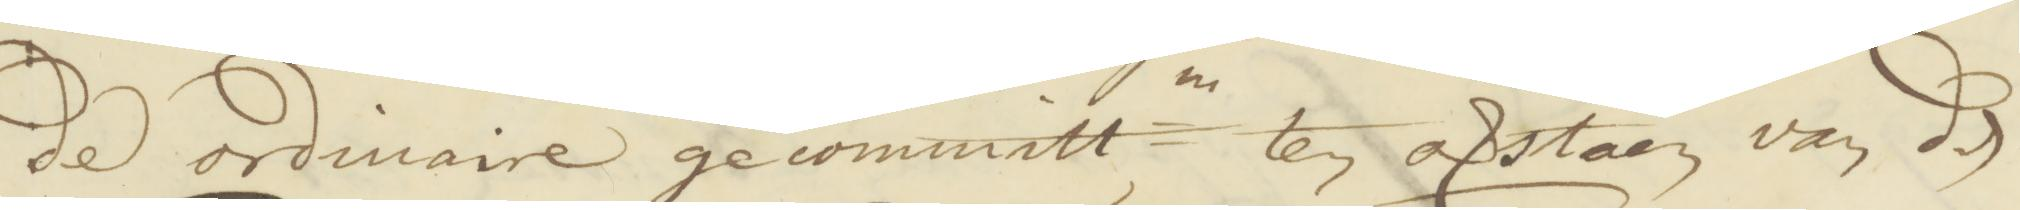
de ordinaire gecommitt=ns ten overstaan van den
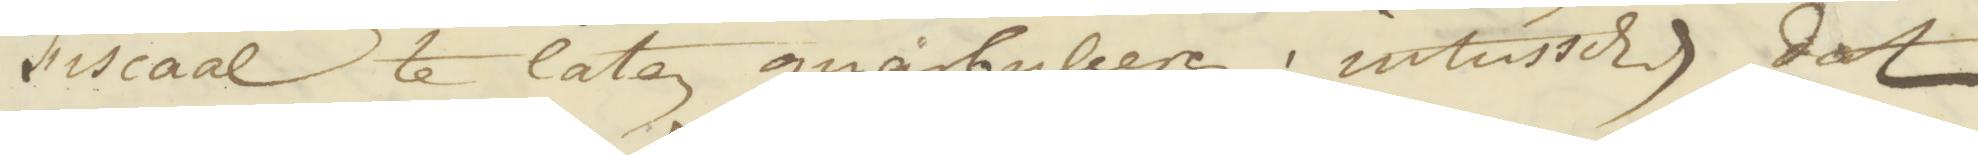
Fiscaal te laten guarbuleeren, intusschen dat
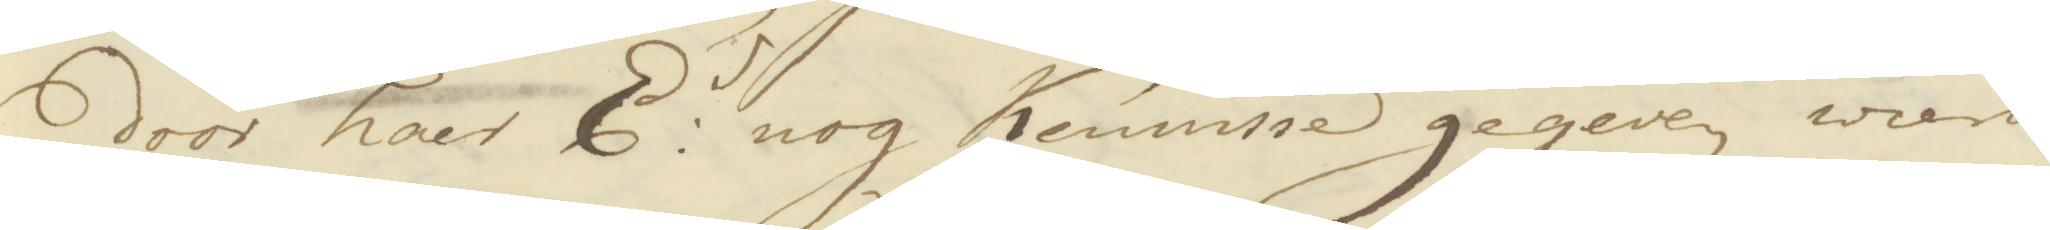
door haer E:s nog kennisse gegeven wierd
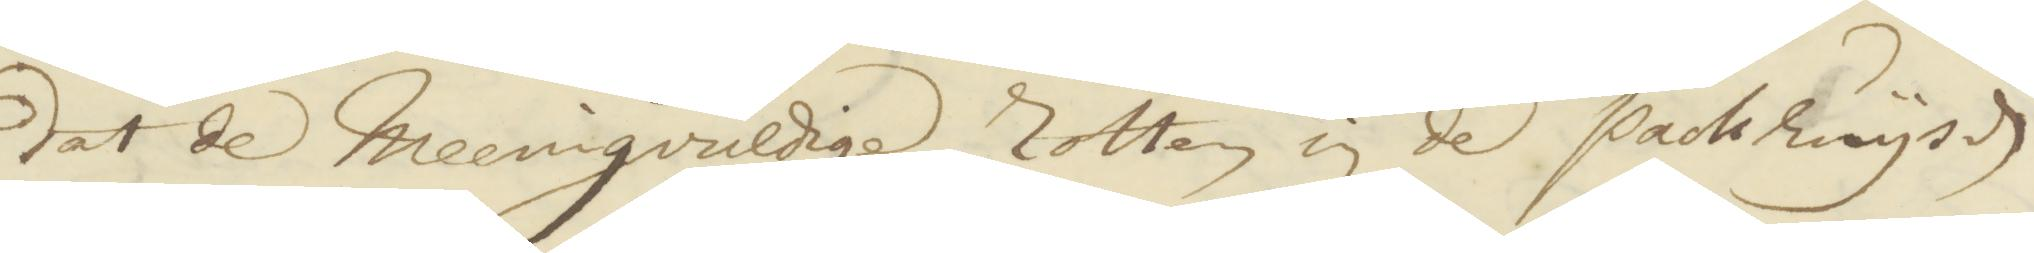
dat de meenigvuldige rotten in de packhuijsen
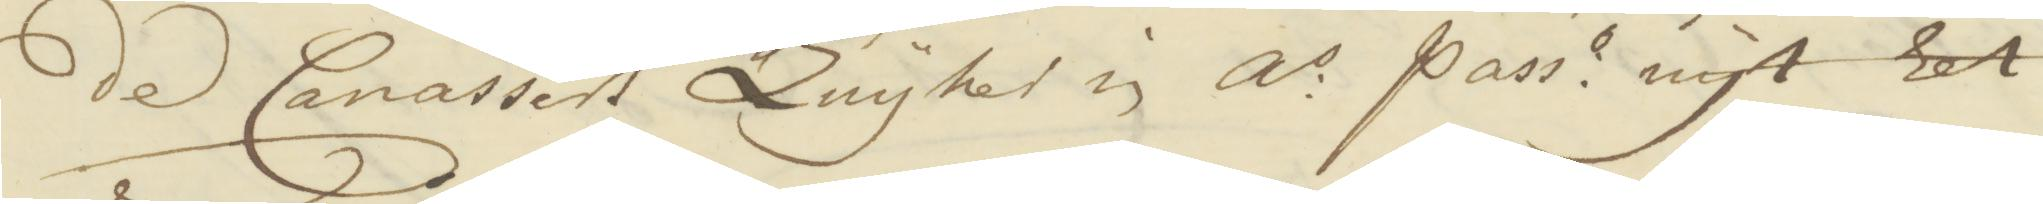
de Canassers zuijker in a:o pass:o uijt het
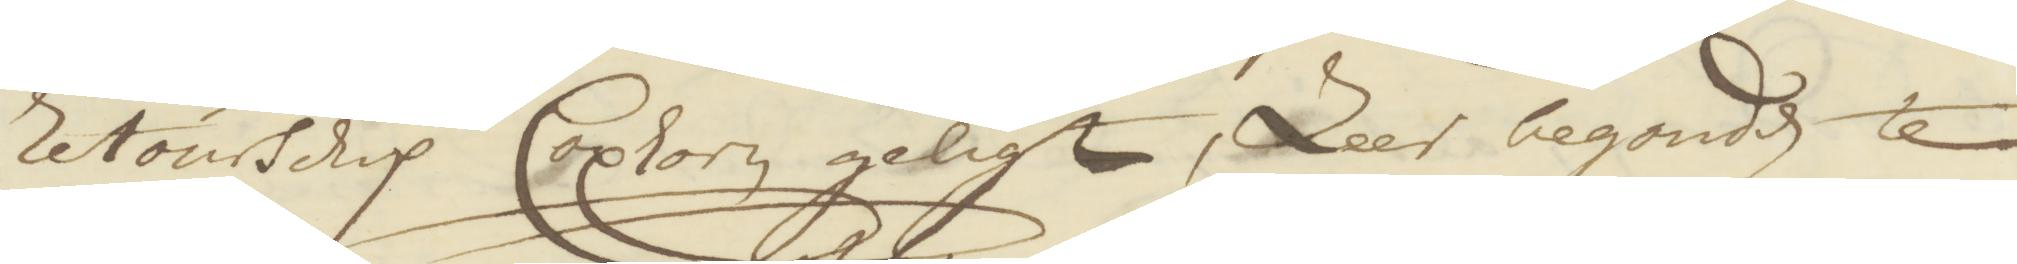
retourschip Coxhoorn geligt, zeer begonden te
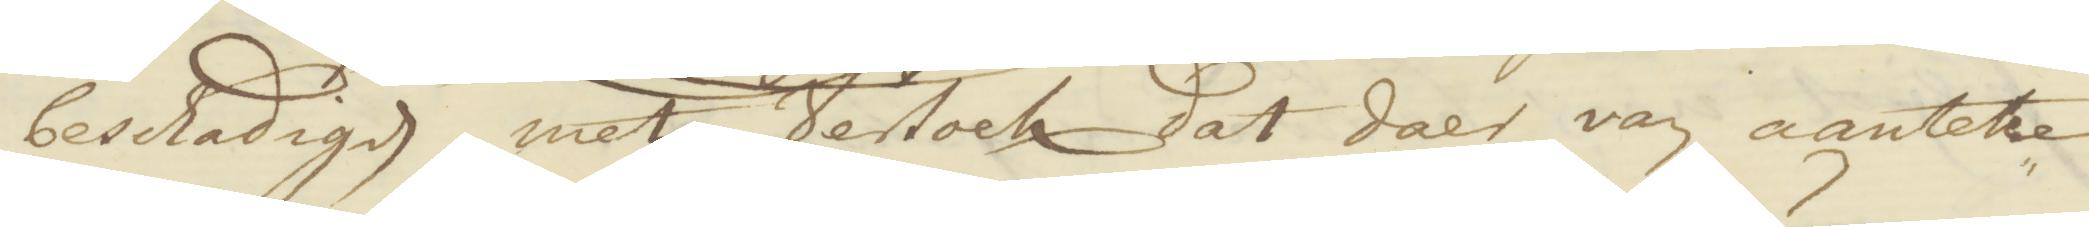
beschadigen, met versoek dat daer van aanteke„
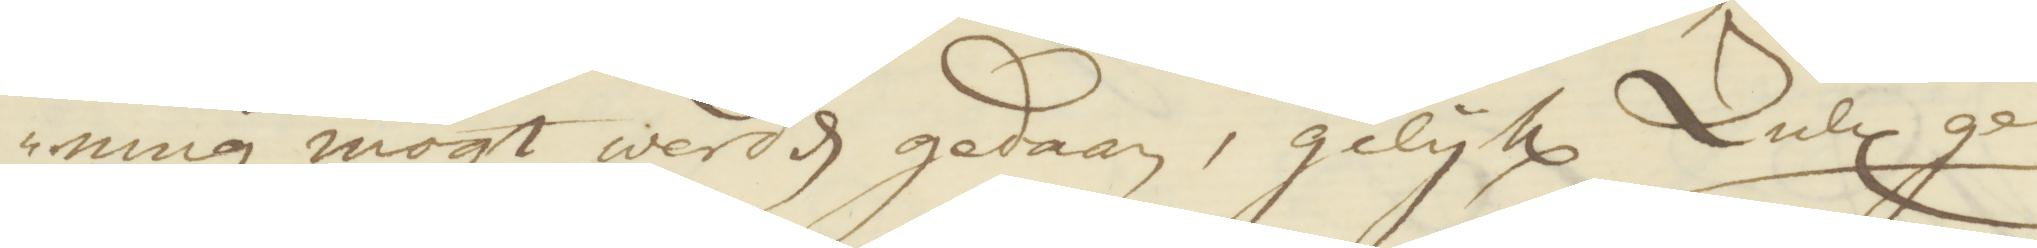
„ning mogt werden gedaan, gelijk zulx ge
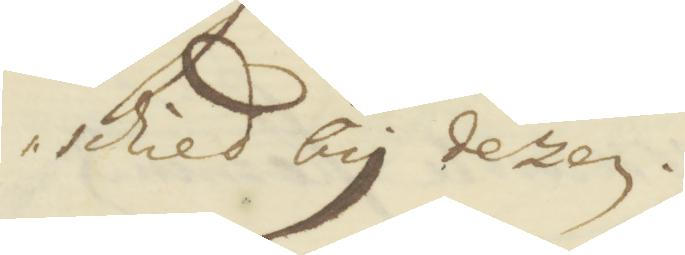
„schied bij dezen.
